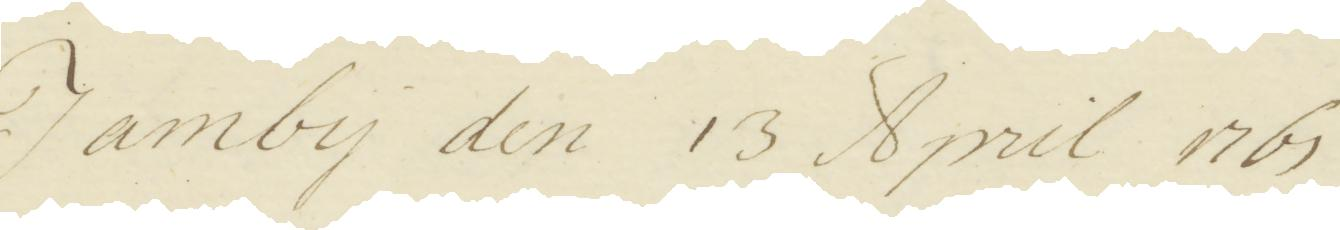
Van Jambij den 13 April 1761
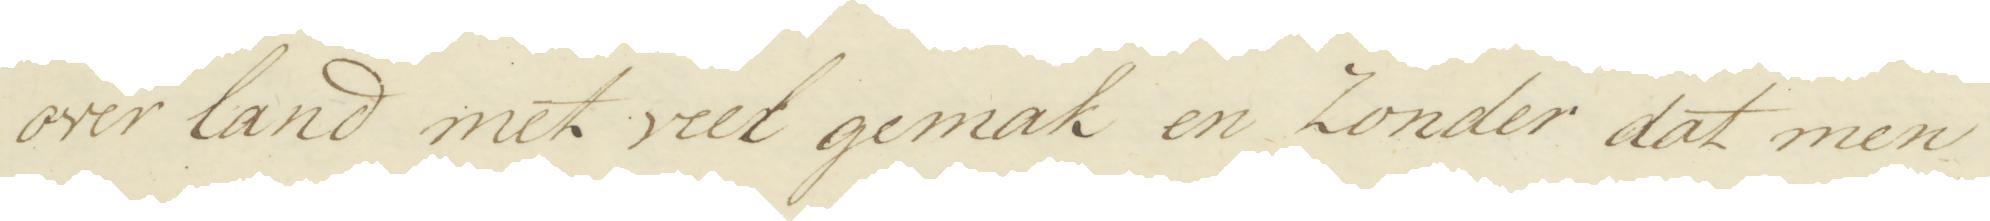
over land met veel gemak en zonder dat men
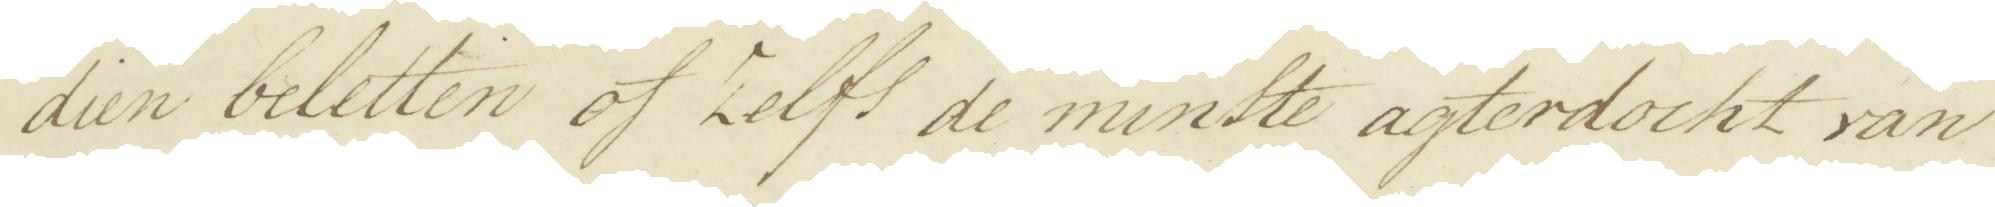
dien beletten of zelfs de minste agterdocht van
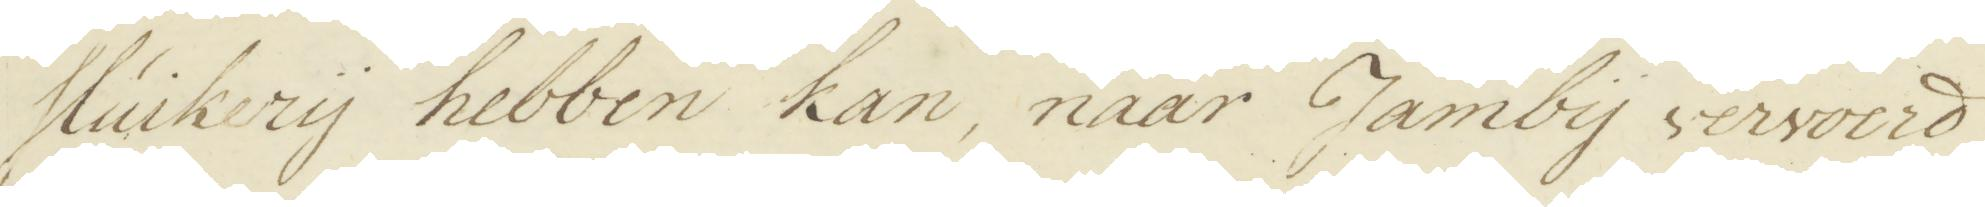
sluikerij hebben kan, naar Jambij vervoerd
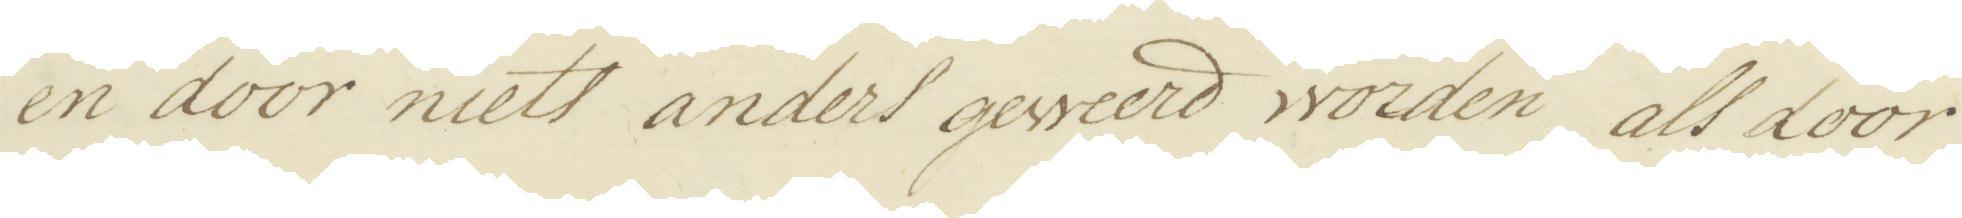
en door niets anders geweerd worden als door
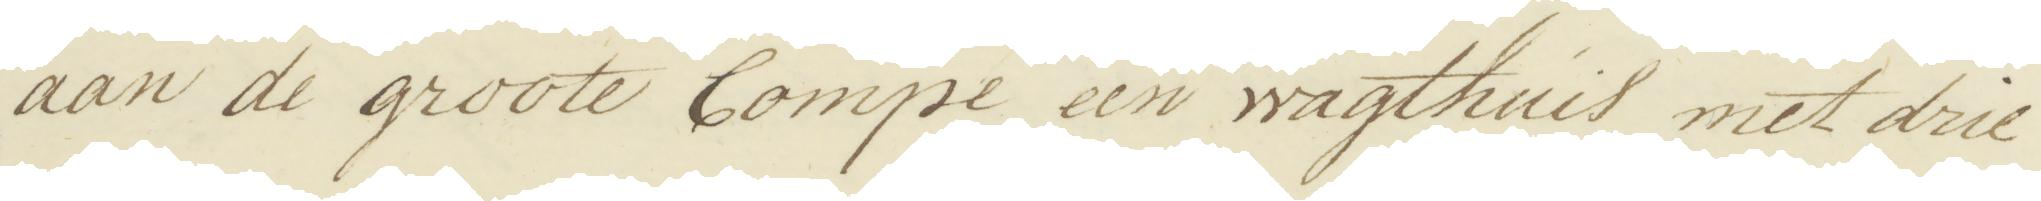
aan de groote Compe een wagthuis met drie
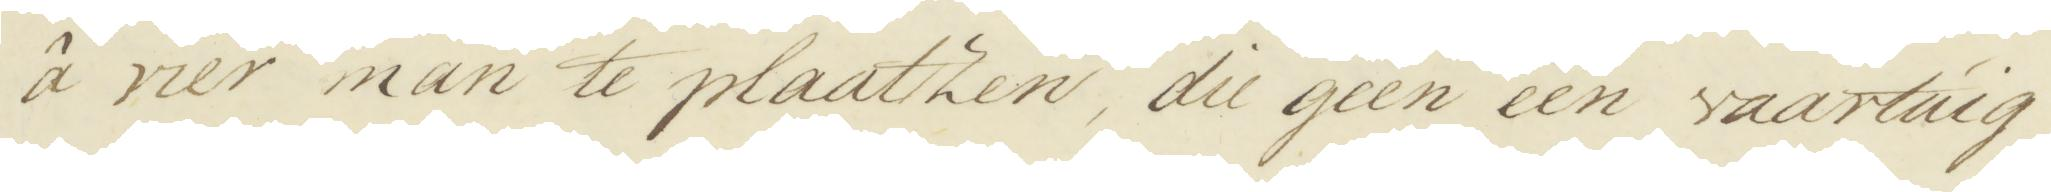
â vier man te plaatzen, die geen een vaartuig
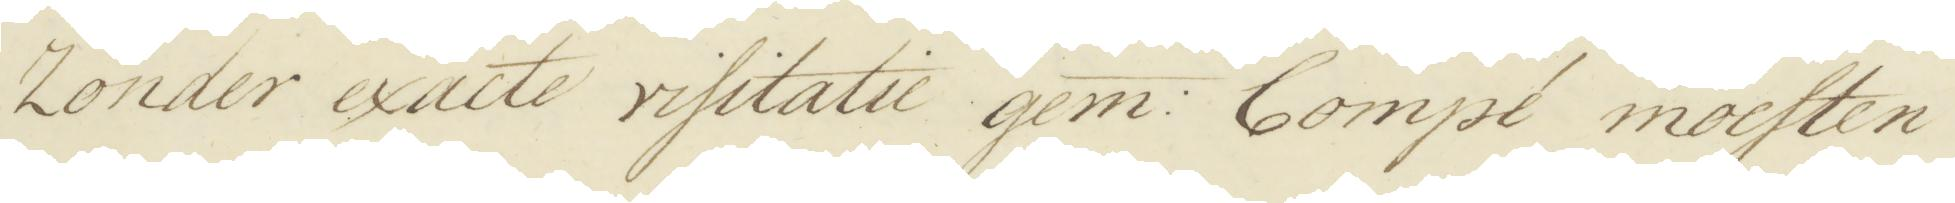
zonder exacte visitatie gem: Compé moesten
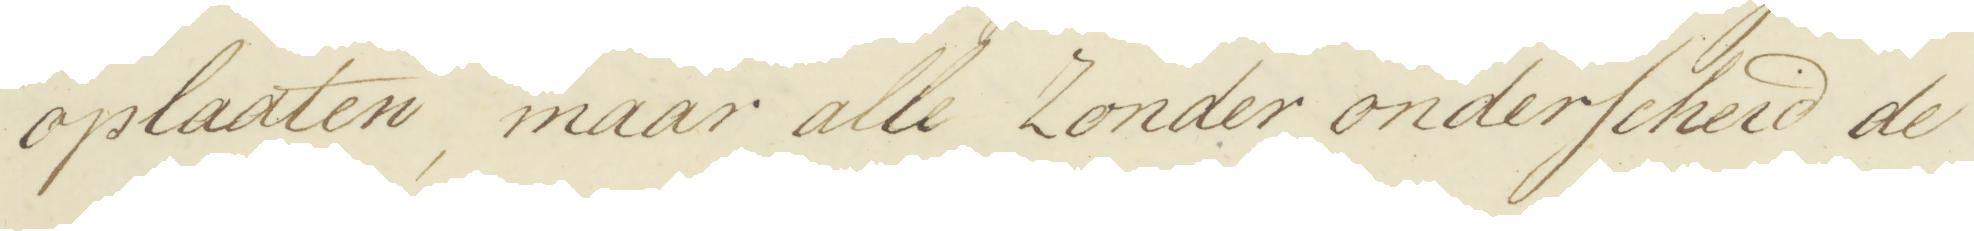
oplaaten, maar alle zonder onderscheid de
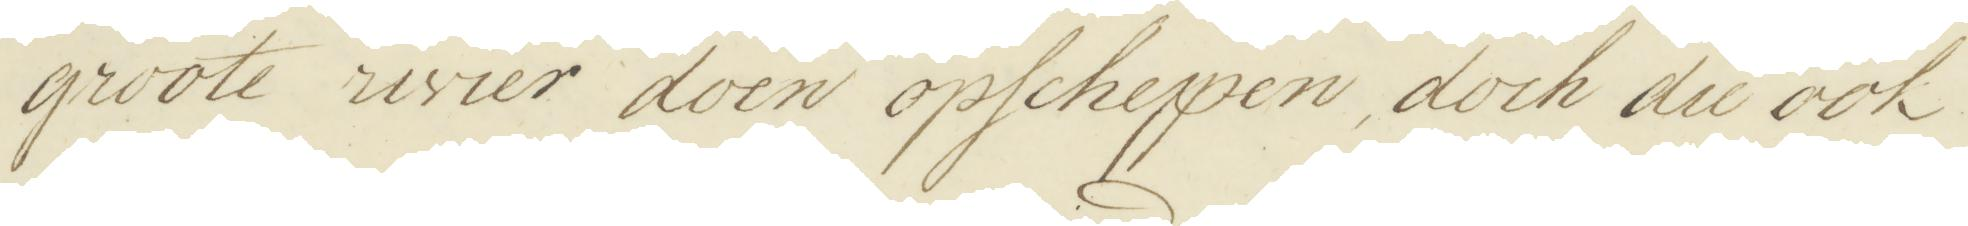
groote rivier doen opscheppen, doch die ook
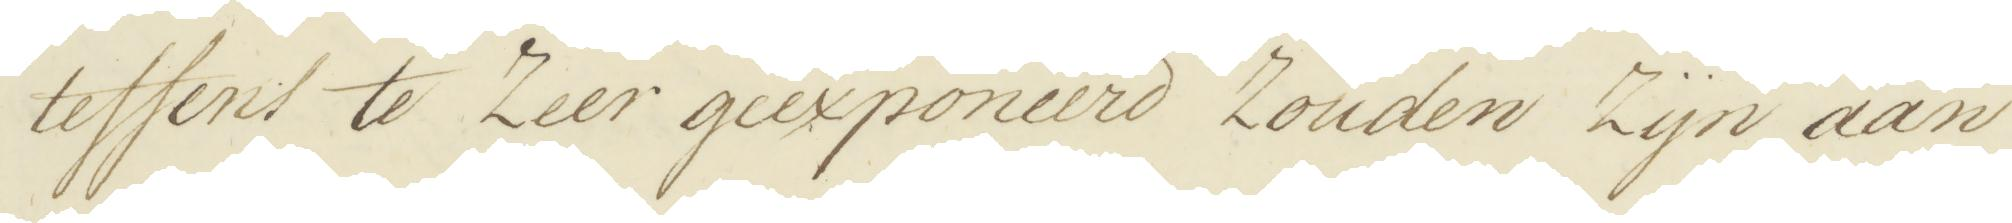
teffens te zeer geexponeerd zouden zijn aan
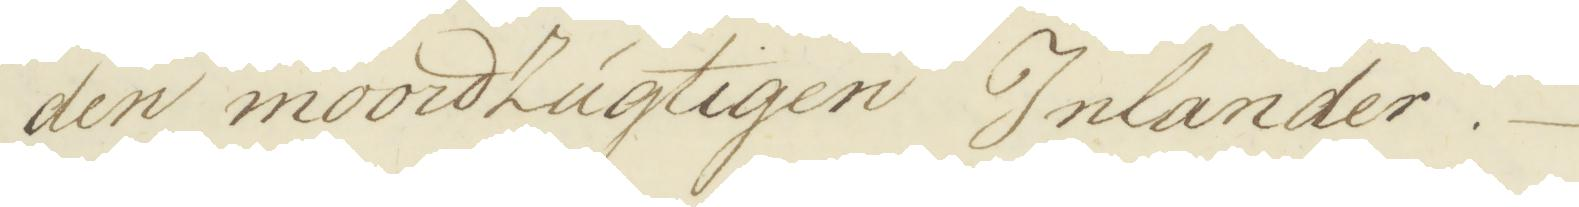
den moordzugtigen Inlander.
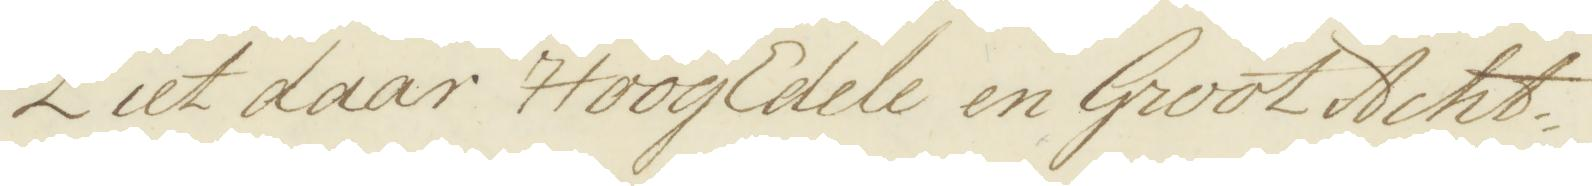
Ziet daar HoogEdele en Groot Acht:
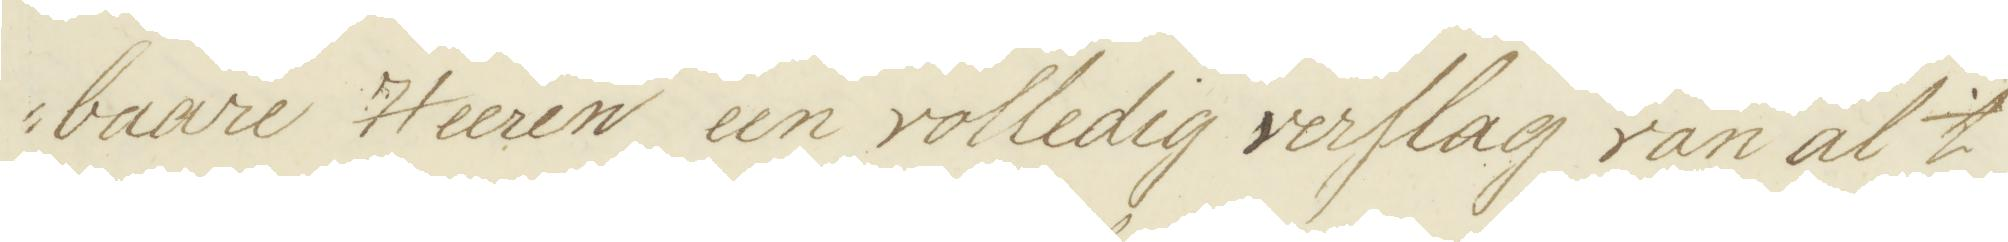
„baare Heeren een volledig verslag van al ’t
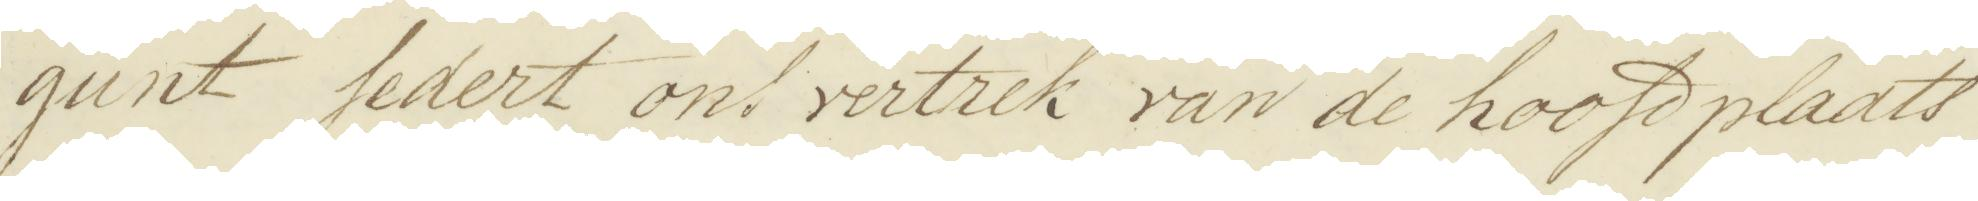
gunt sedert ons vertrek van de hoofdplaats
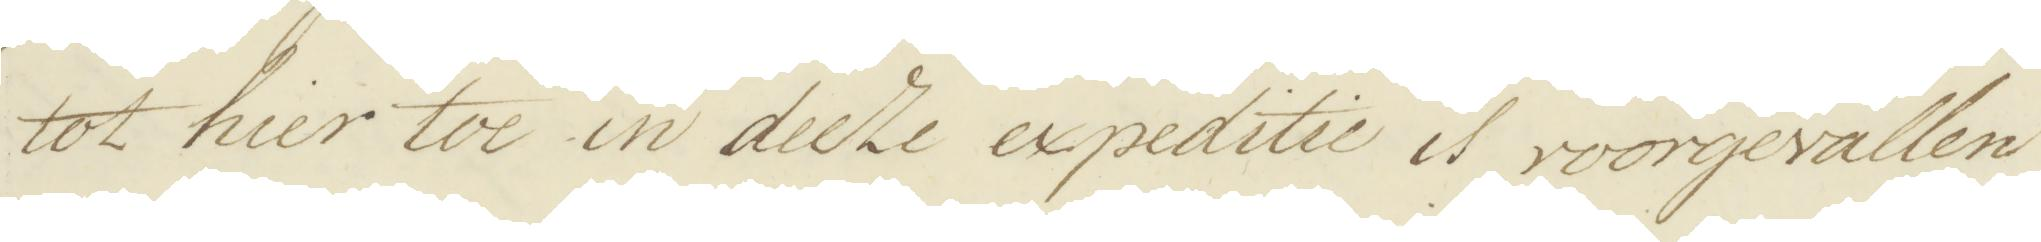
tot hier toe in deeze expeditie is voorgevallen
